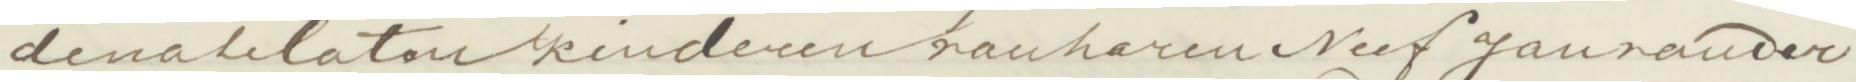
de natelaten kinderen van haren Neef Jan van der
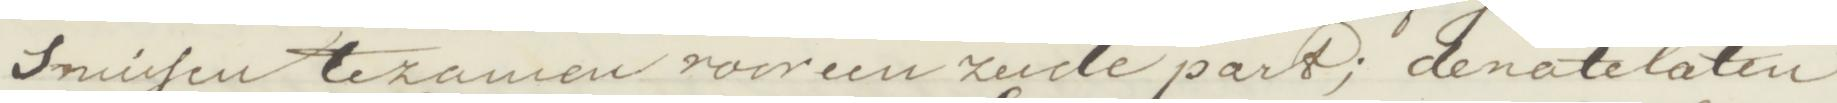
Smissen tezamen voor een zesde part; de natelaten
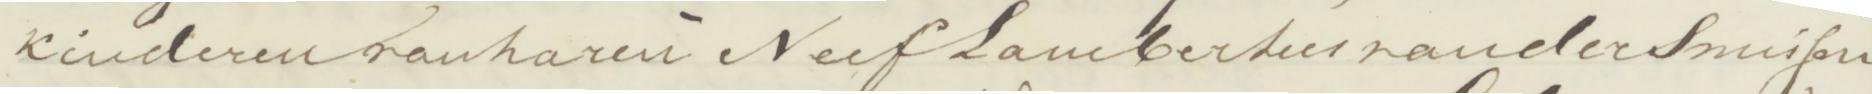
kinderen van haren Neef Lambertus van der Smissen
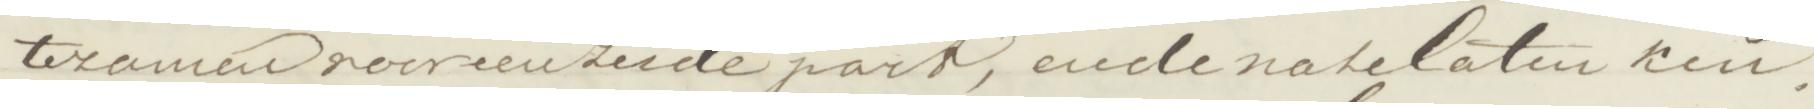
tezamen voor een zesde part, en de natelaten kin,
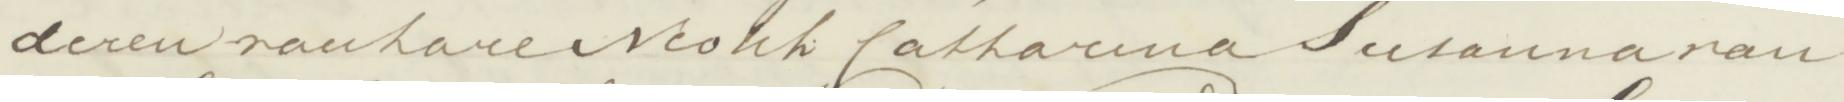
,deren van hare Nicht Catharina Susanna van
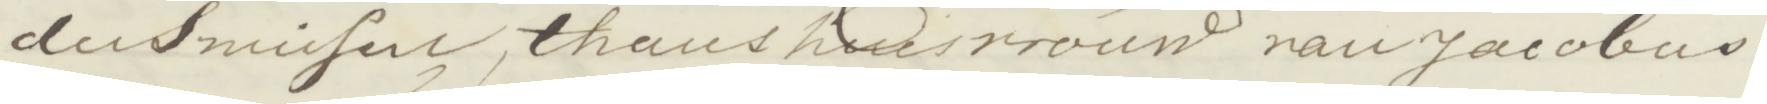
der Smissen, thans huisvrouw van Jacobus
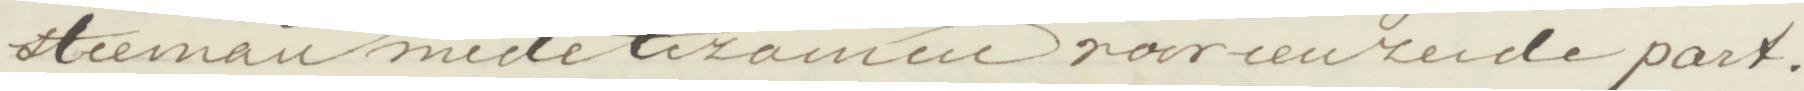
Heeman mede tezamen voor een zesde part.
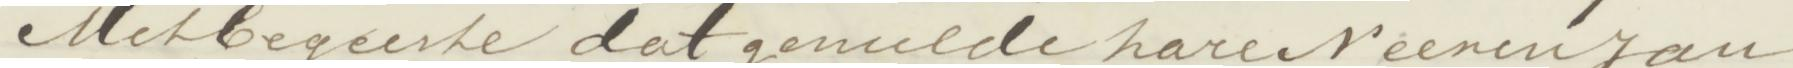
Met begeerte dat gemelde hare Neeven Jan
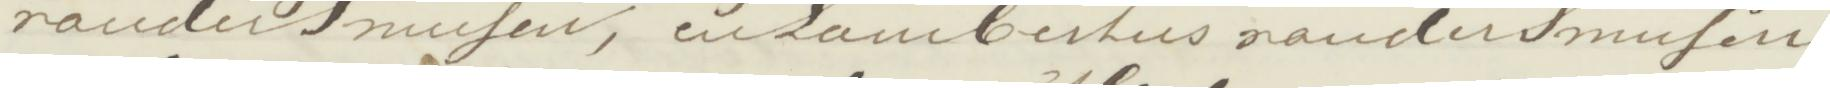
van der Smissen en Lambertus van der Smissen
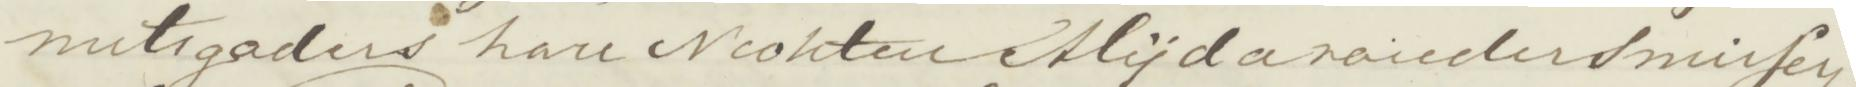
mitsgaders hare Nichten Alijda van der Smissen
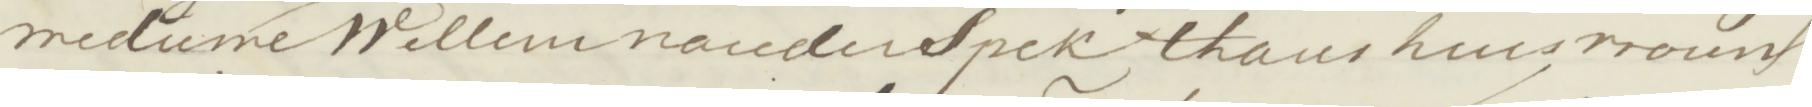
weduwe Willem van der Spek thans huisvrouw
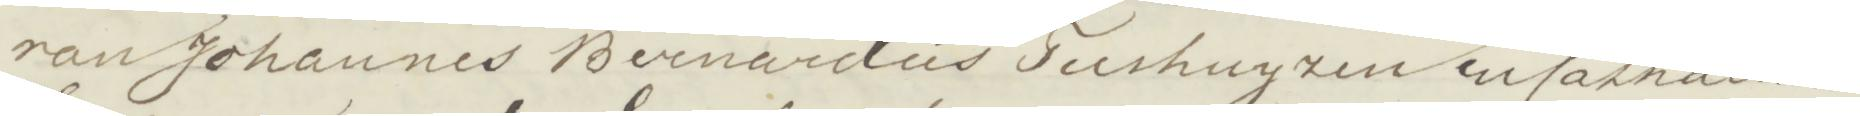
van Johannes Bernardus Terhuyzen en Catharina
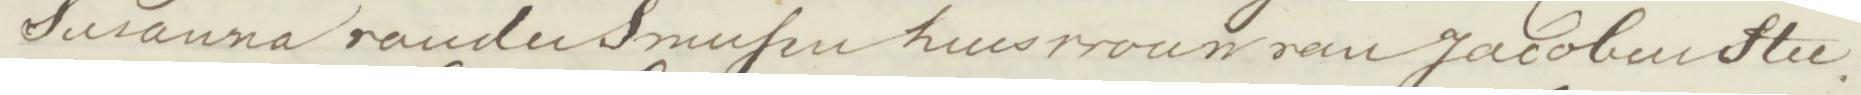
Susanna van der Smissen huisvrouw van Jacobus Hee,
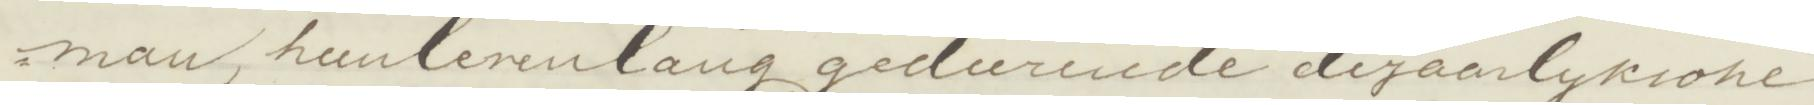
=man, hun leven lang gedurende de jaarlyksche
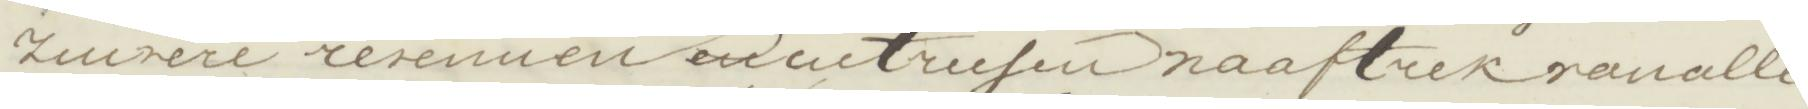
zuivere revenuen en intressen na aftrek van alle
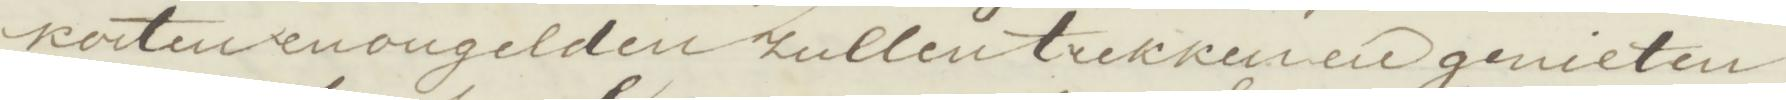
korten en ongelden zullen trekken en genieten,
